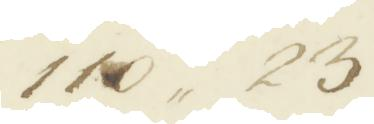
110 „ 23
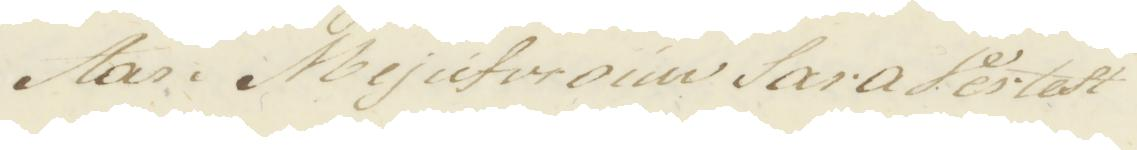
Aan Mejufvrouw Sara Vertest
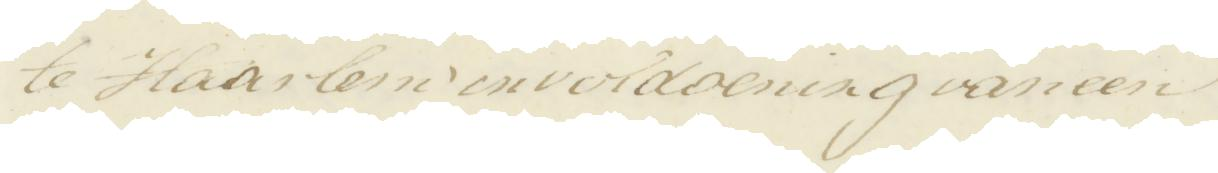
te Haarlem en voldoening van een
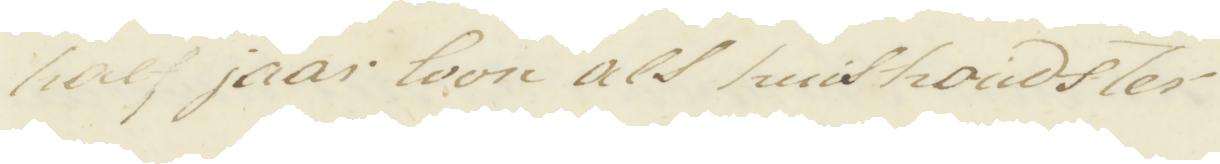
half jaar loon als huishoudster
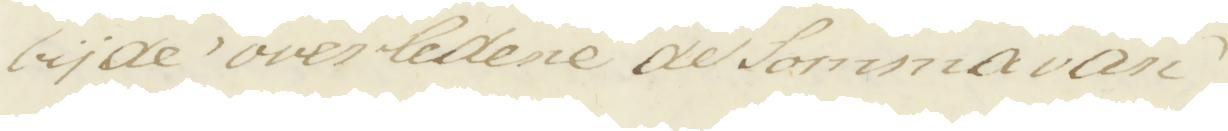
bij de overledene de somma van
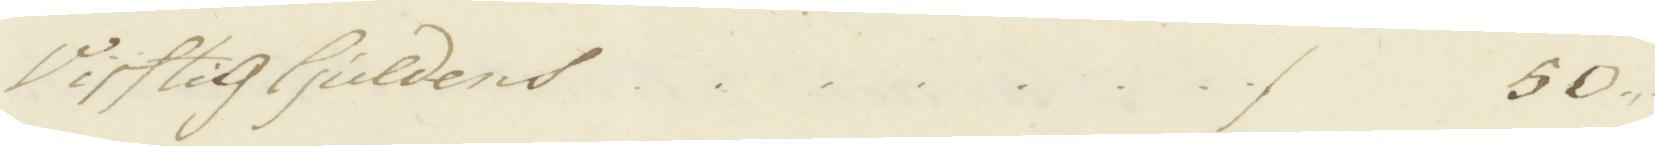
Vijftig Guldens . . . . . . . . ƒ 50 „
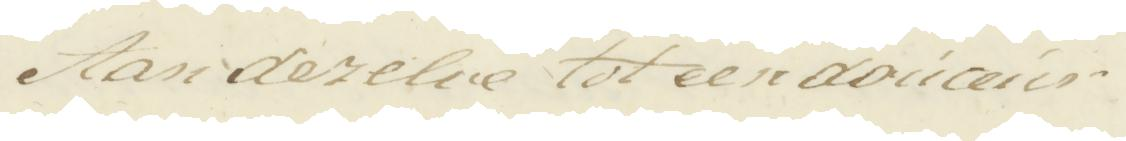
Aan dezelve tot een douceur
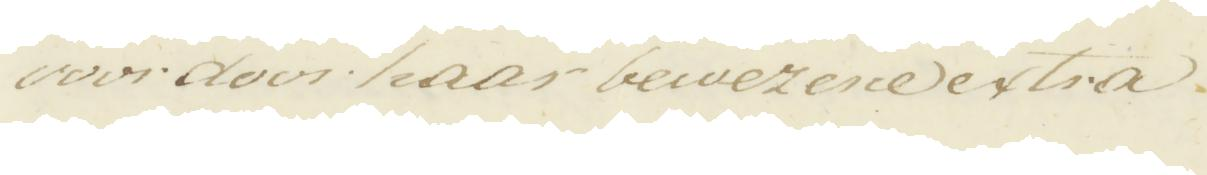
voor door haar bewezene extra
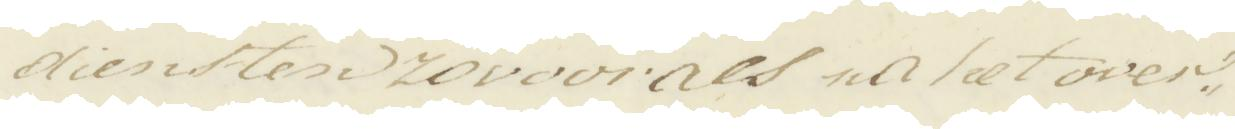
diensten zo voor als na het over„
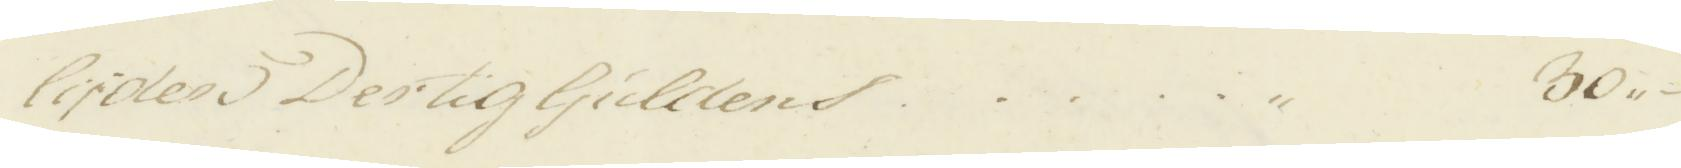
lijden Dertig Guldens . . . . . „ 30 „
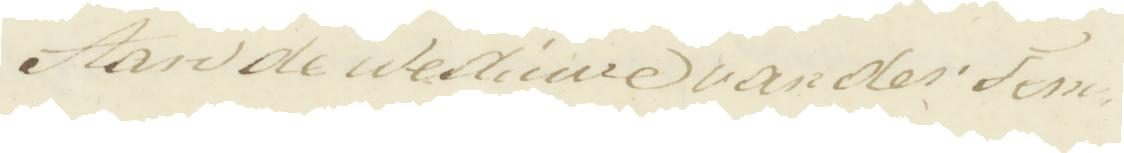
Aan de weduwe van der Tem„
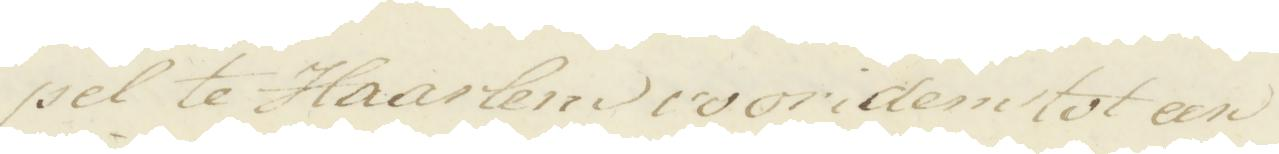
pel te Haarlem voor idem tot een
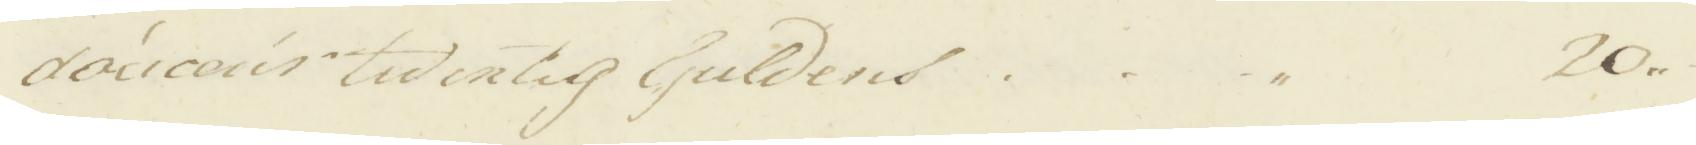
douceur twintig Guldens . . . „ 20„
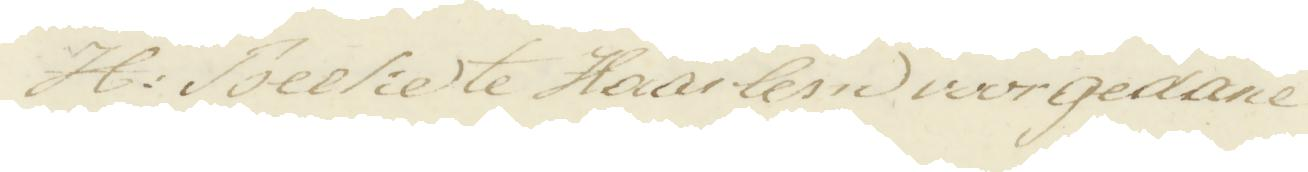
H: Beeke te Haarlem voor gedane
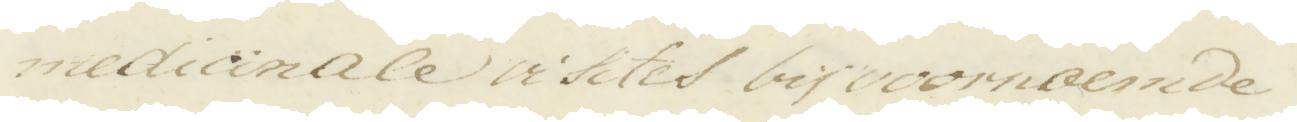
medicinale visites bij voornoemde
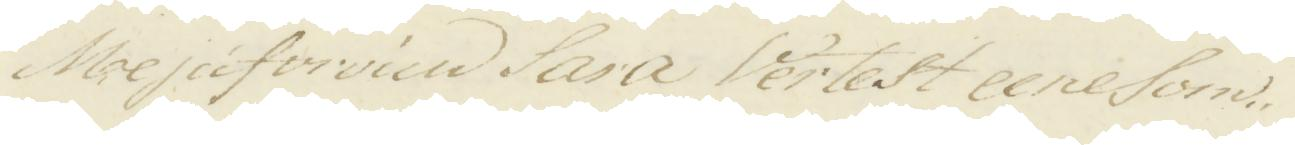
Mejufvrouw Sara Vertest eene som„
